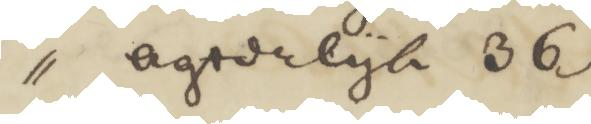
„ agterlijk 36
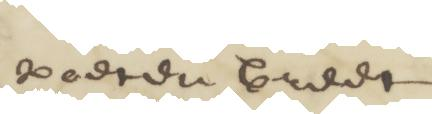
voeten breet
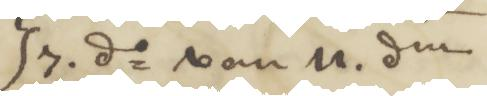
7. d=o van 11. dm
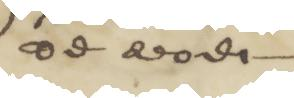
de voet
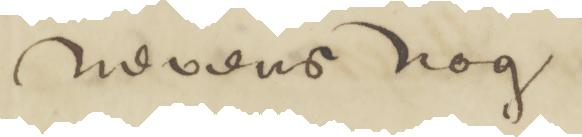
nevens nog
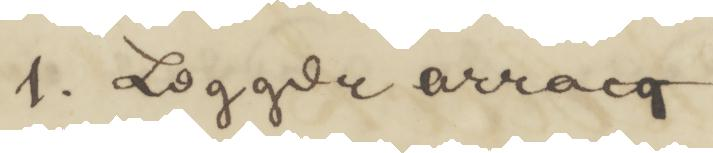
1. Legger arracq
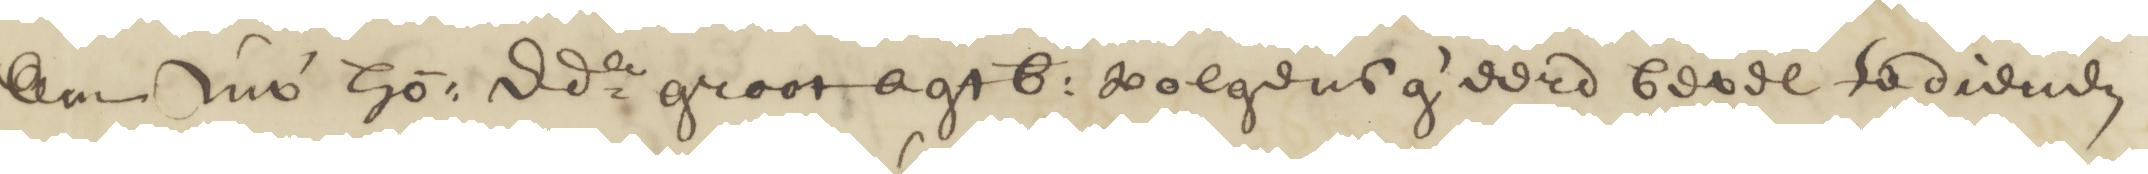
Aen uw ho: EE=e groot agtb: volgens g’eerd bevel te dienen
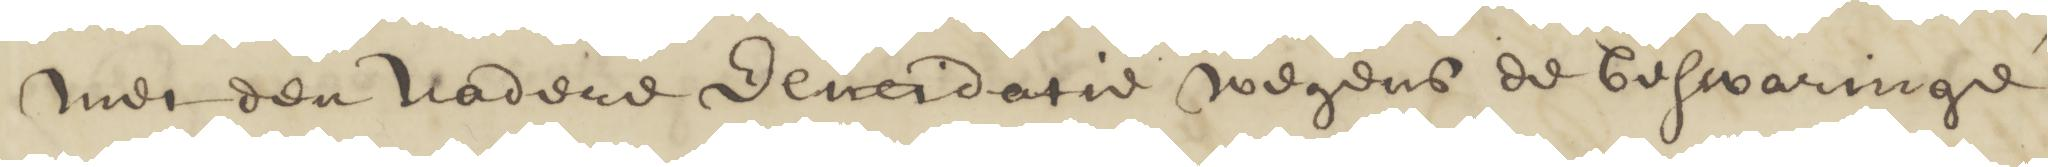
met den nadere Elucidatie wegens de beswaringe
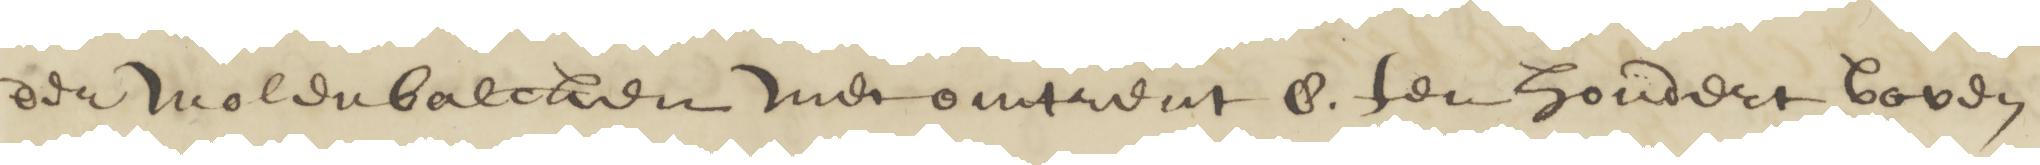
der molenbalcken met omtrent 8. ten hondert boven
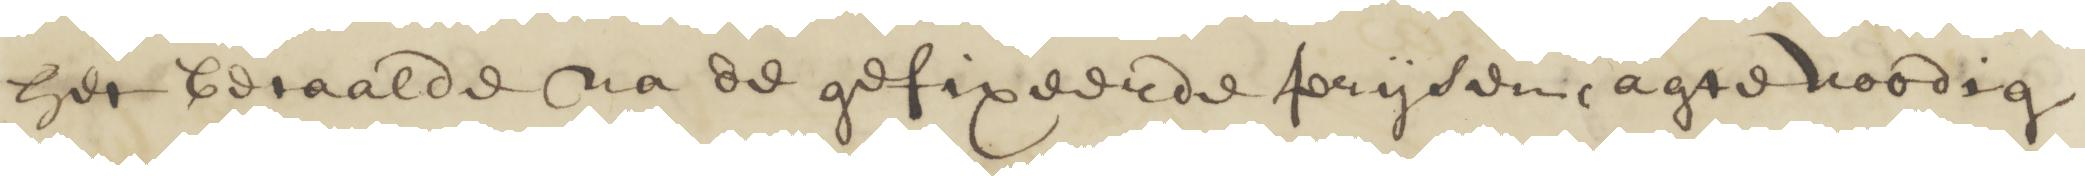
het betaalde na de gefixeerde prijsen, agte noodig
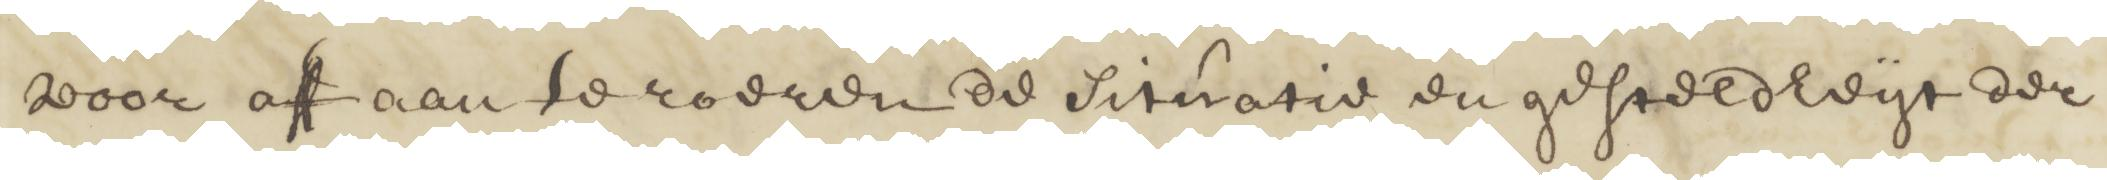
voor aff aan te roeren de situatie en gesteldheijt der
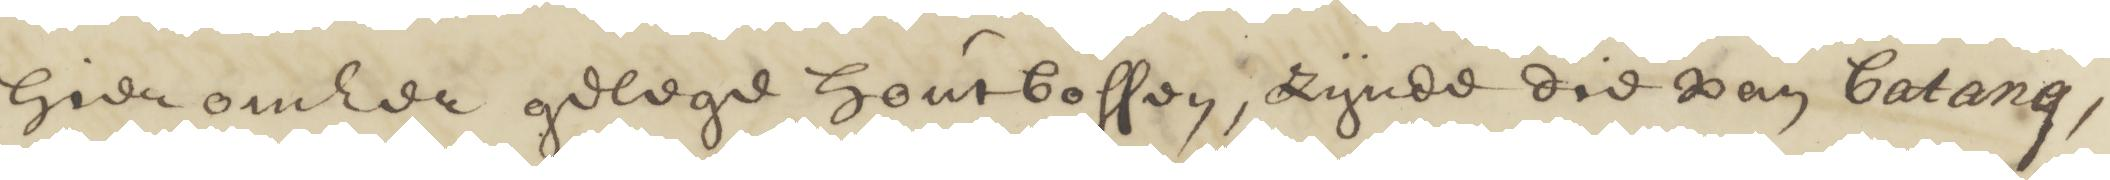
hier omher gelege houtbossen, zijnde die van batang,
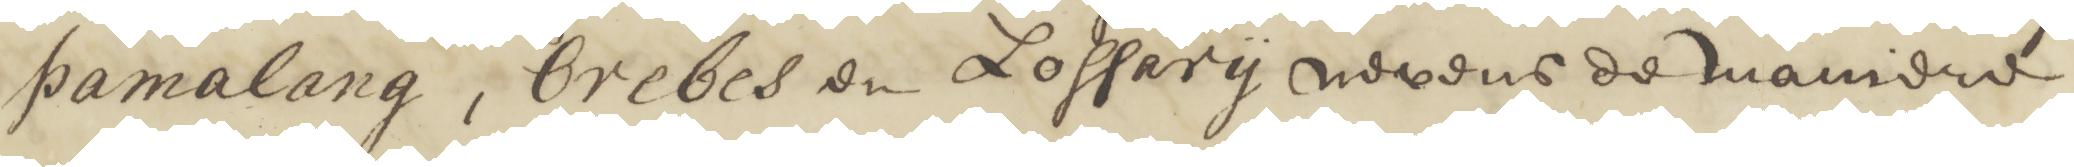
Pamalang, brebes en Lossarij nevens de maniere
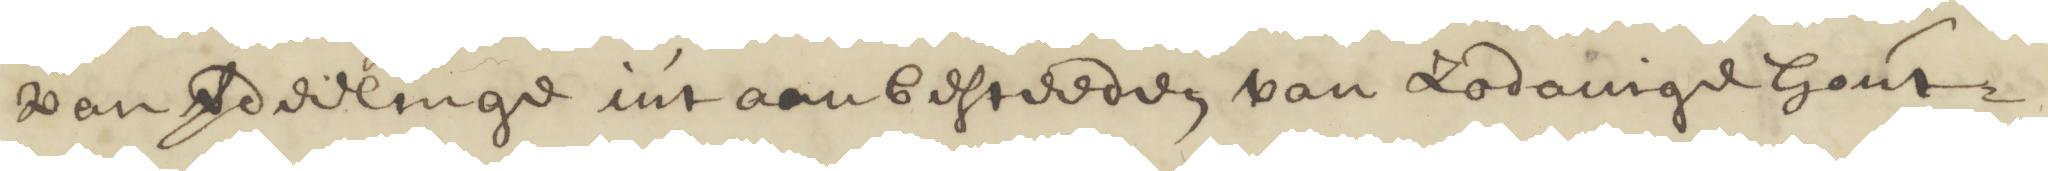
van verdeelinge in’t aan besteeden van zodanige hout„
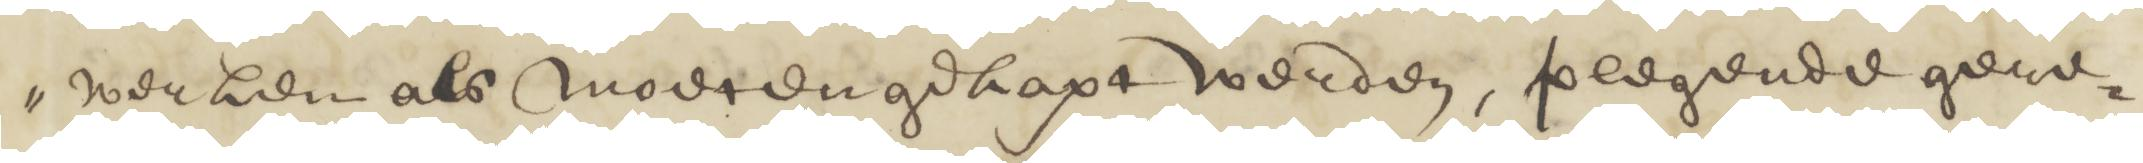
„werken als moeten gekapt werden, plegende gere„
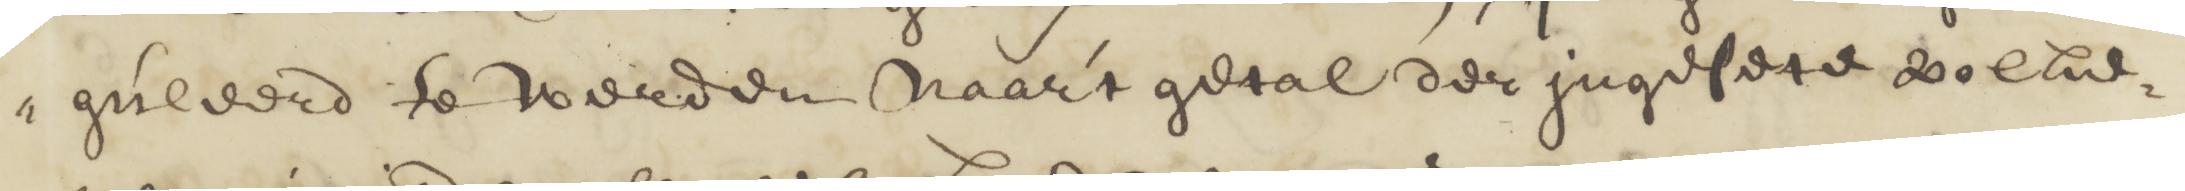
„guleerd te werden naar't getal der jngesete volke„
